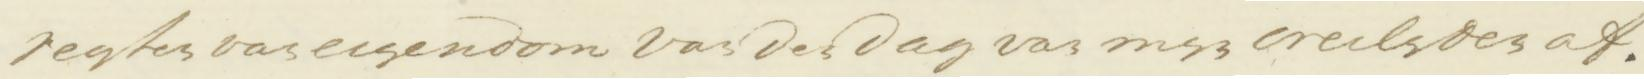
regten van eigendom van der dag van myn overlyden af.
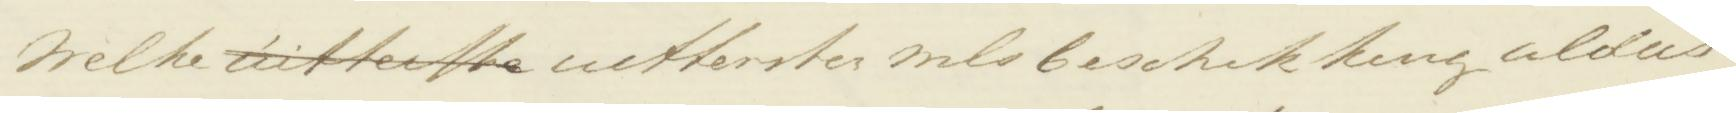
welke uitterste uittersten wils beschikking aldus
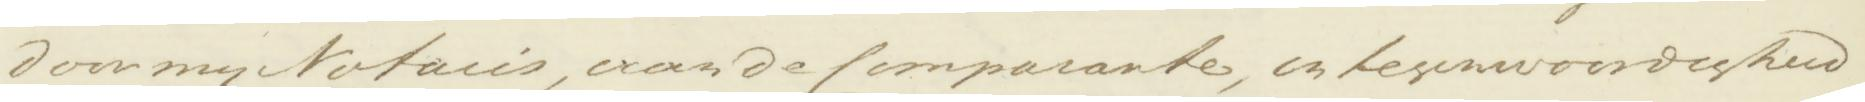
door mij Notaris, aan de Comparante, in tegenwoordigheid
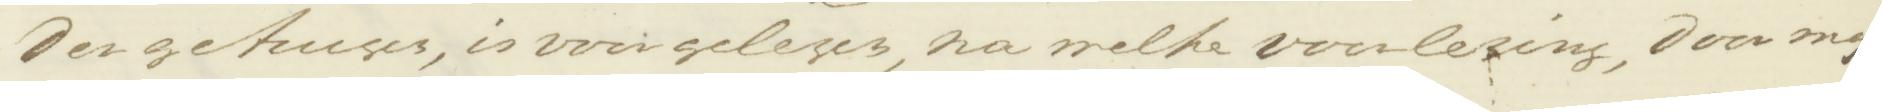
der getuigen, is voor gelezen, na welke voorlezing, door my
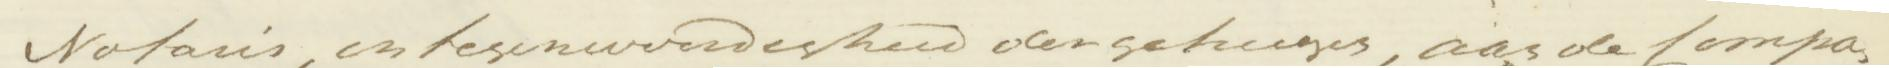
Notaris, in tegenwoordigheid der getuigen, aan de Compa„
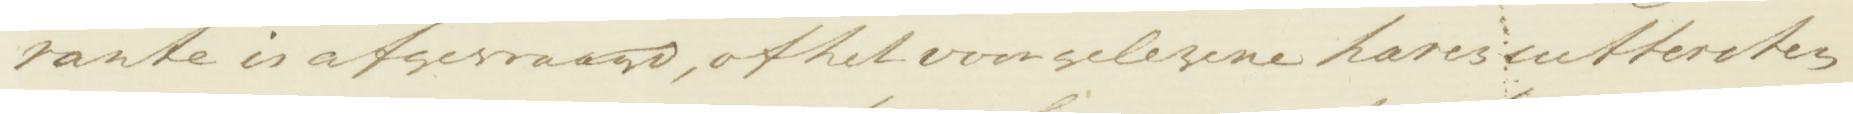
rante is afgevraagd, of het voor gelezene haren uittersten
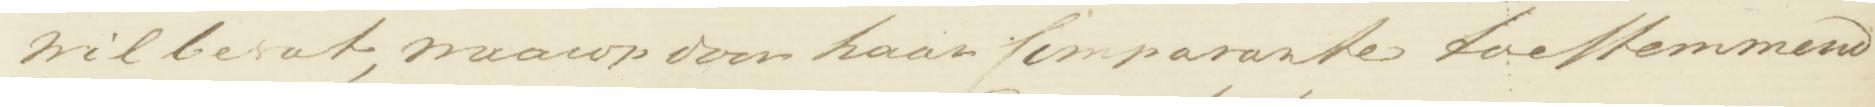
wil bevat, waarop door haar Comparante toestemmend
